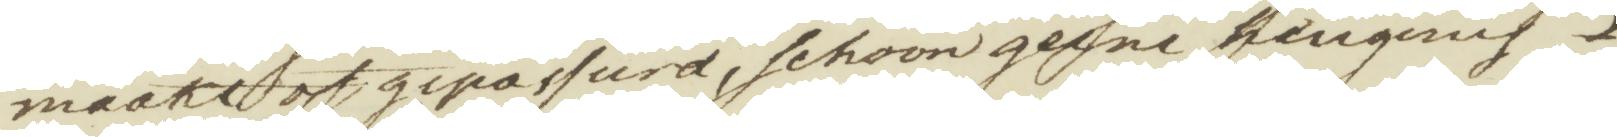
maakt of gepasseerd, schoon geene heugenis
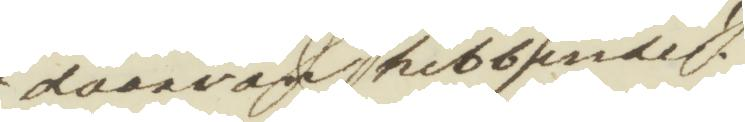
daarvan hebbende.
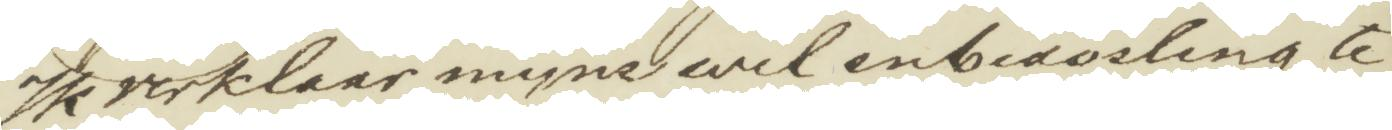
Jk verklaar myne wil en bedoeling te
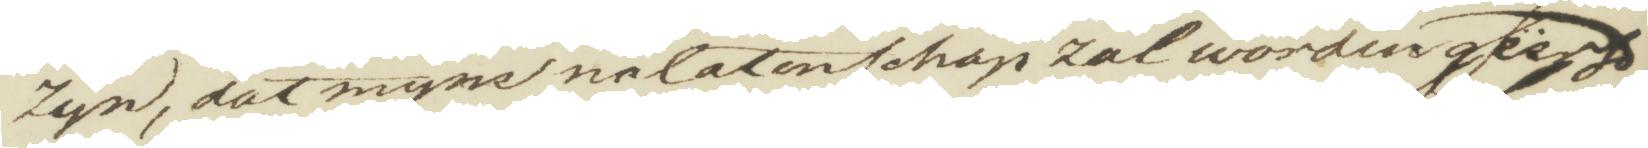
zyn, dat myne nalatenschap zal worden geërfd
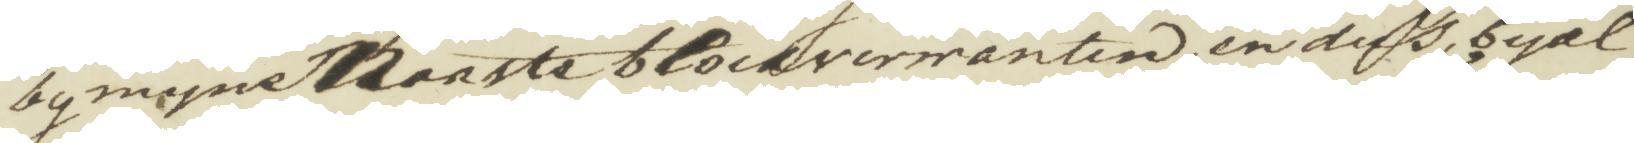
by myne Naaste bloedverwanten, en dus, by al
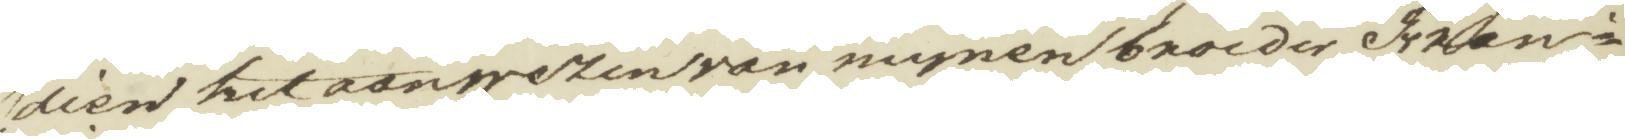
dien het aanwezen van mynen broeder Fran=
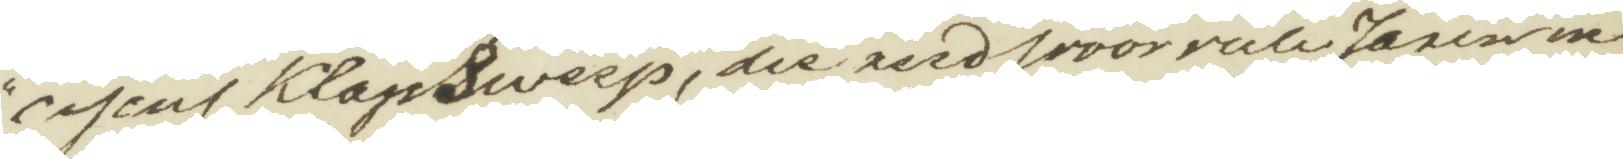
ciscus Klapsweep, die reeds voor veele Jaren in
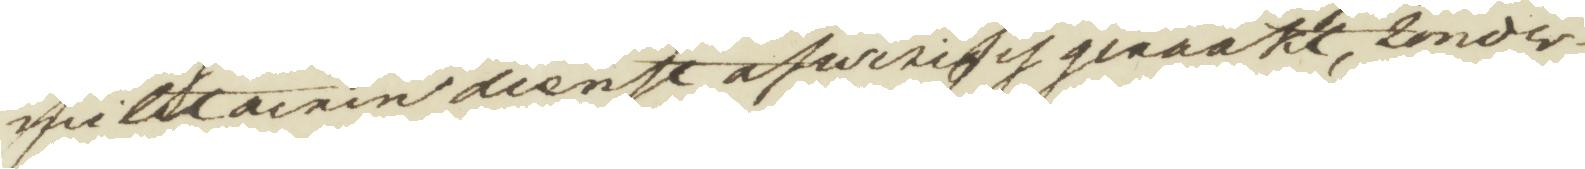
militairen dienst afwezig is geraakt, zonder
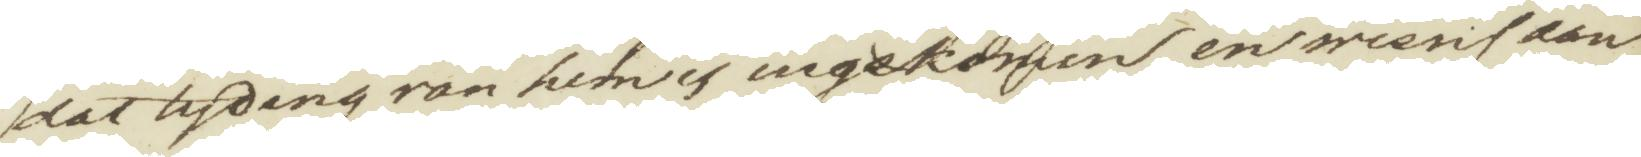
dat tyding van hem is ingekomen, en wiens aan
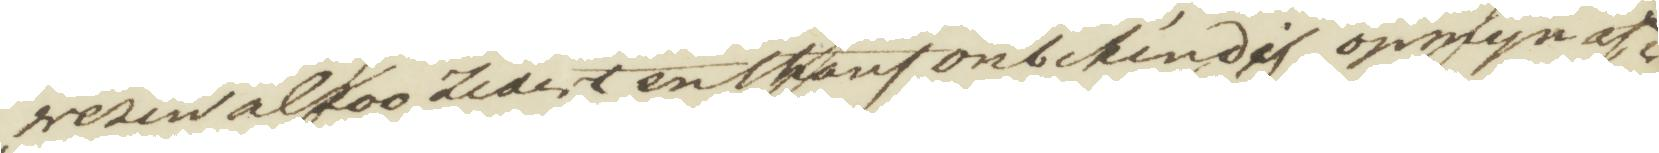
wezen alzoo zedert en thans onbekend is, op myn af
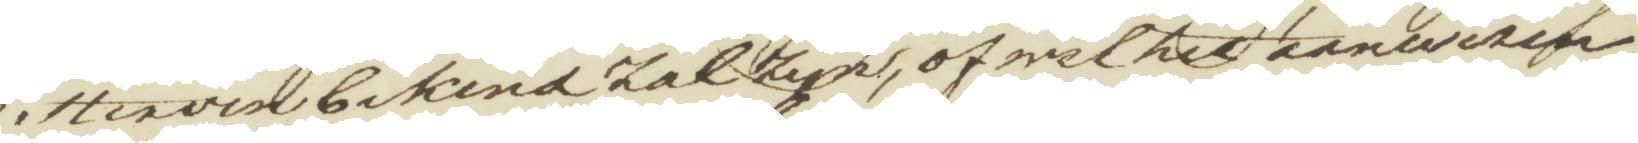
„sterven bekend zal zyn, of wel het aanwezen
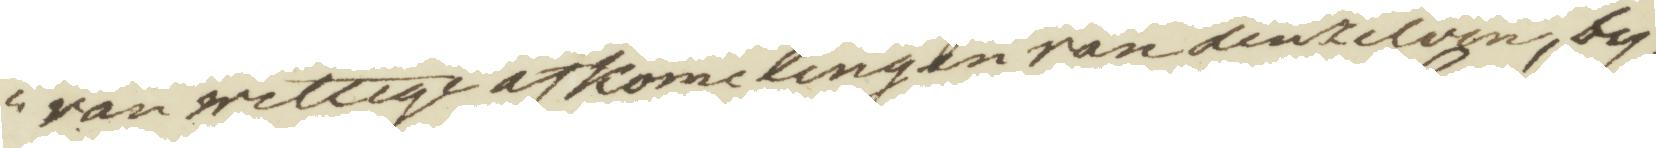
„van wettige afkomelingen van denzelven, by
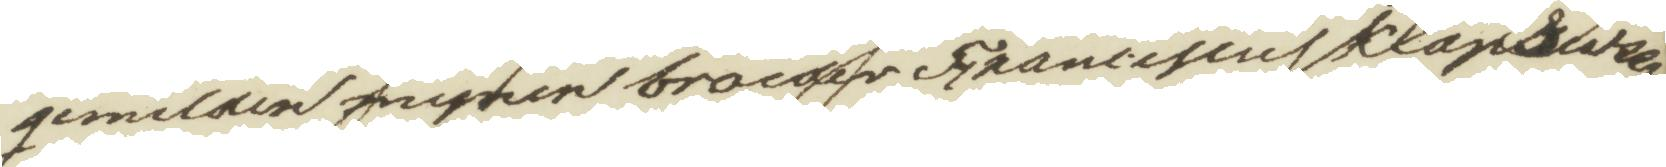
gemelden mynen broeder Franciscus Klapsweep
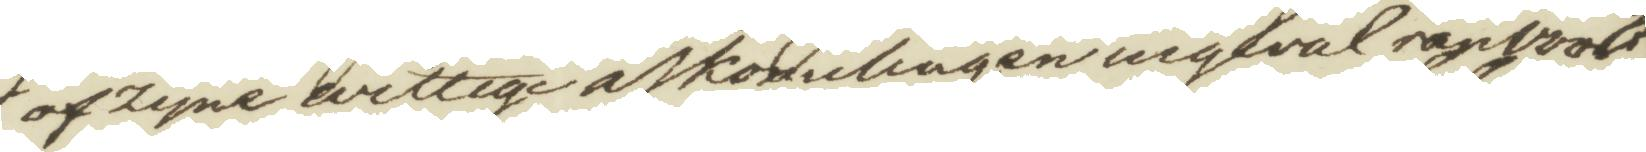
of zyne wettige afkomelingen ingeval van voor
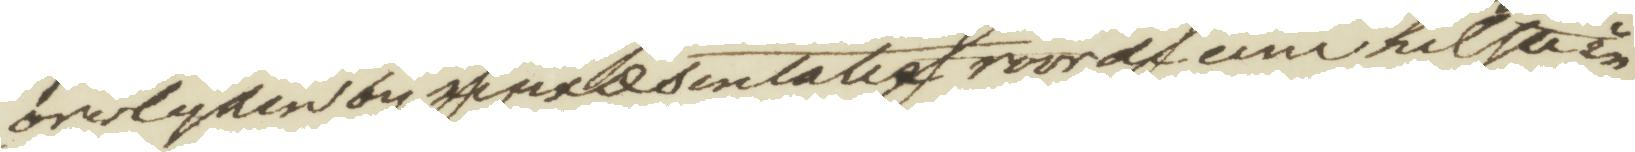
overlyden by representatie voor de eene helfte en
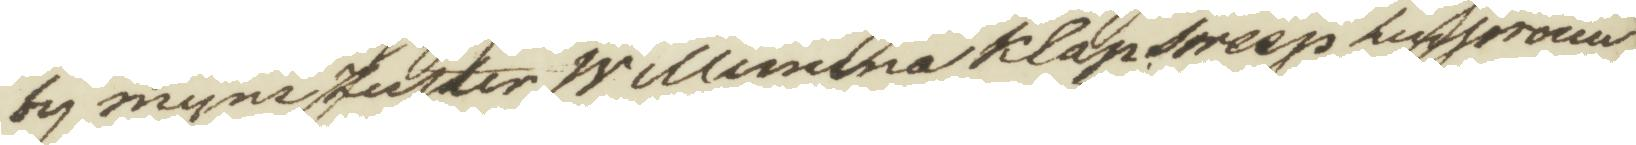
by myne Zuster Willemina Klapsweep huisvrouw
